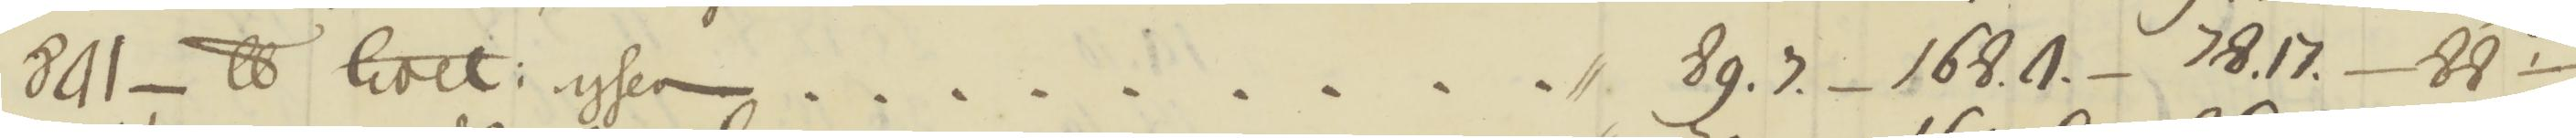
841 — lb hoet: yser 89.3. — 168.4. 78.17. —88¼
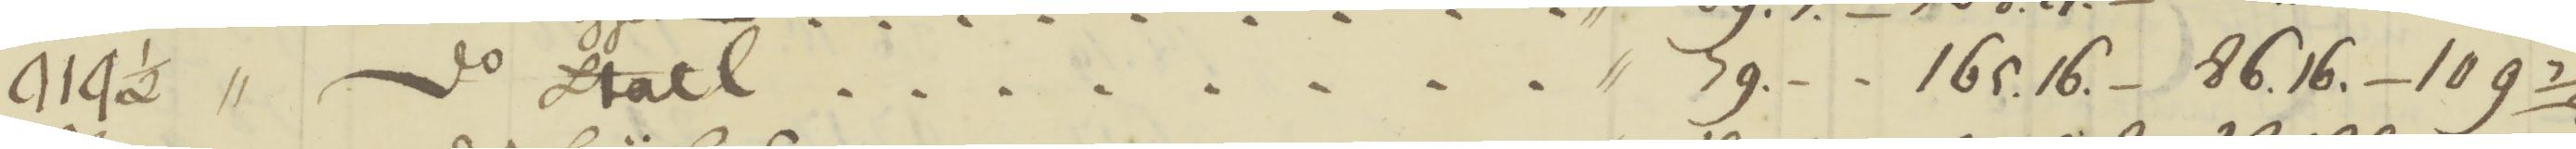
414½ „ d:o stael. . . . . . . . „ 79.- - 165.16.- 86.16.—109 7/8
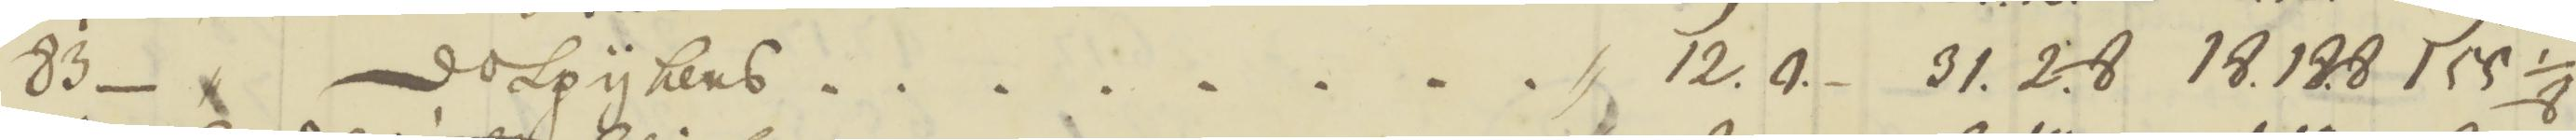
83— „ d:o Spijkers . . . . . . . . „ 12: 4.— 31.2.8 18.18.8.155 1/8
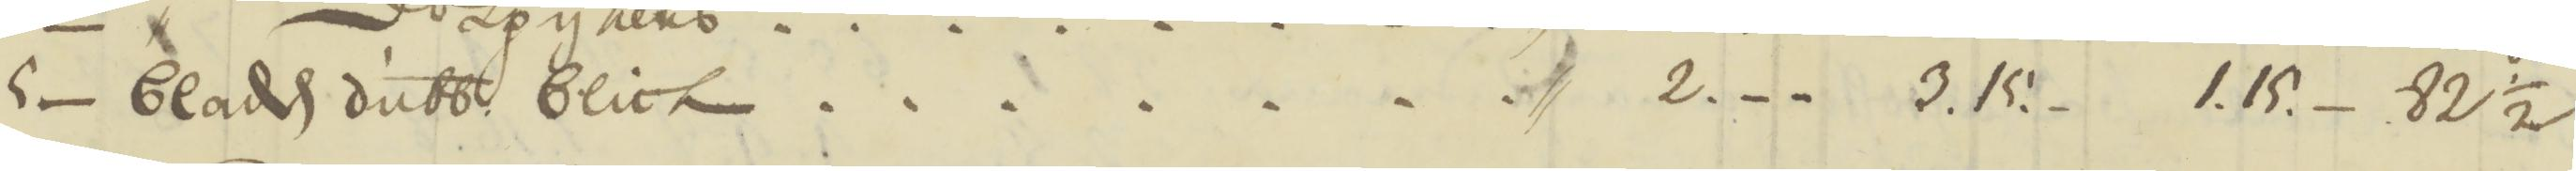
5— bladen dubb. blick . . . . . . „ 2.- - 3.15:- 1.15.— 82½
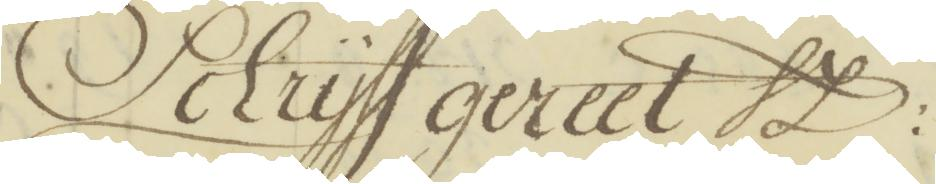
Schrijff gereet sz:
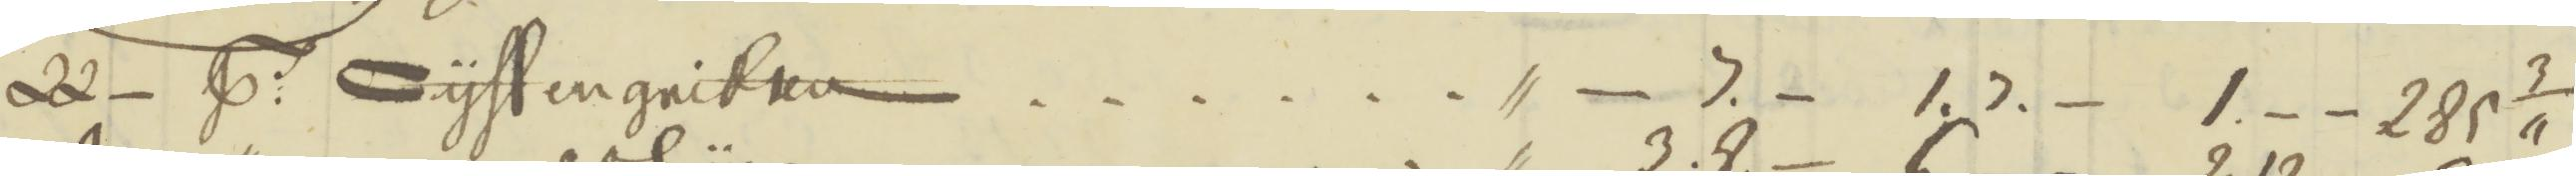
22– p:s Cijffer griften . . . . . . „ — 7. — 1. 7. — 1.— — 285¾
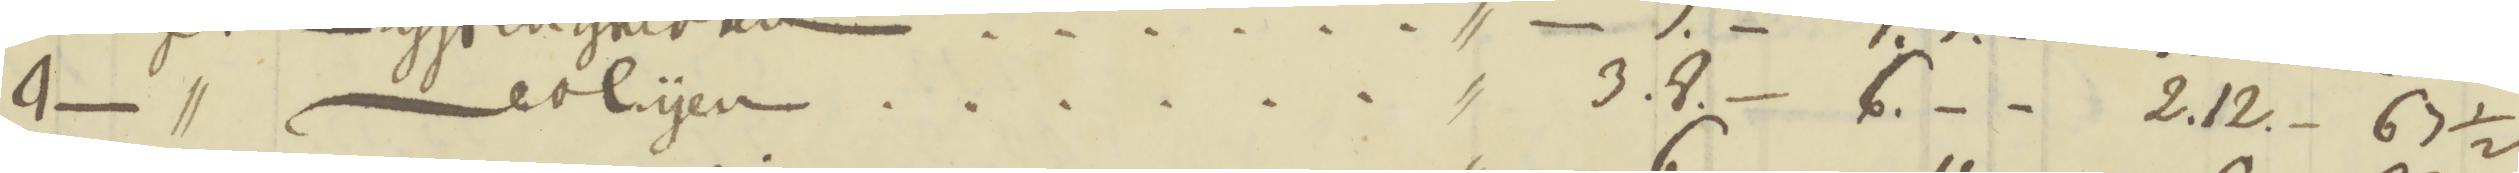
4— „d:o lijen . . . . . . „ 3. 8. — 6.- - 2.12.- 67½
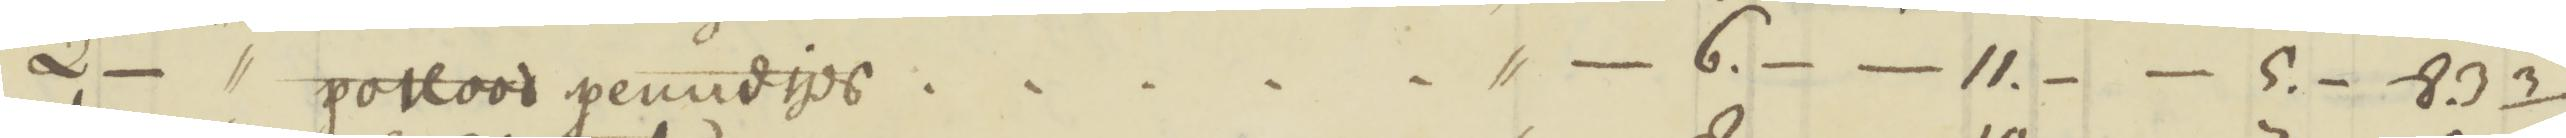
2—„ potlood pennetjes . . . . . „— 6.— — 11. — — 5.— 83 3/8
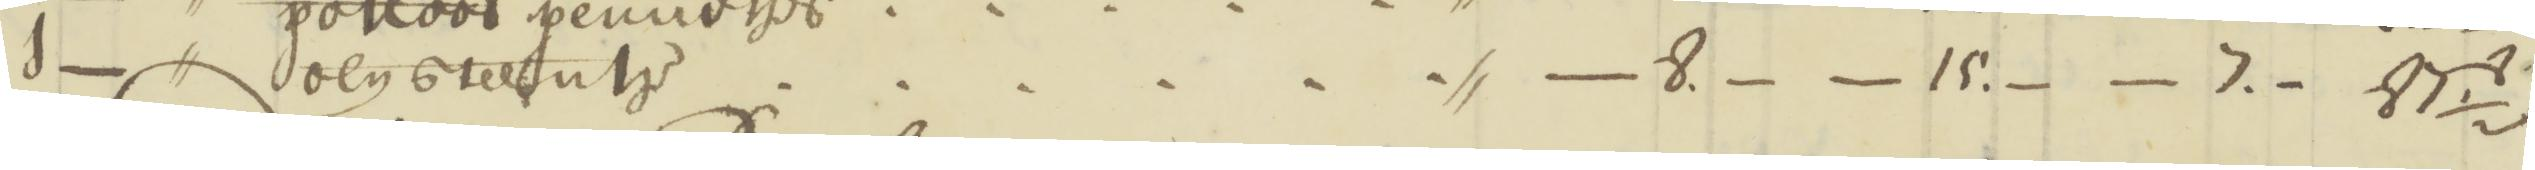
1—„ oly steentje . . . . . . „ — 8. — — 15. — —7.— 87½
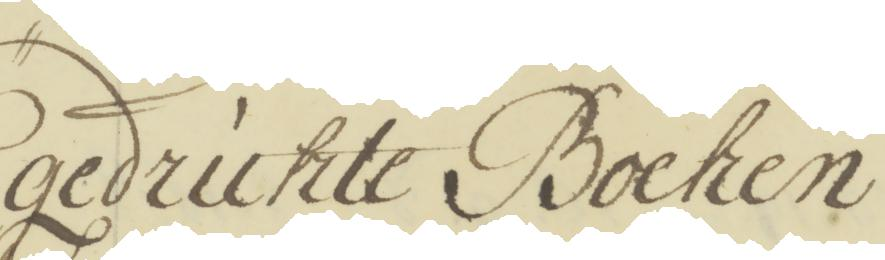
gedrukte Boeken
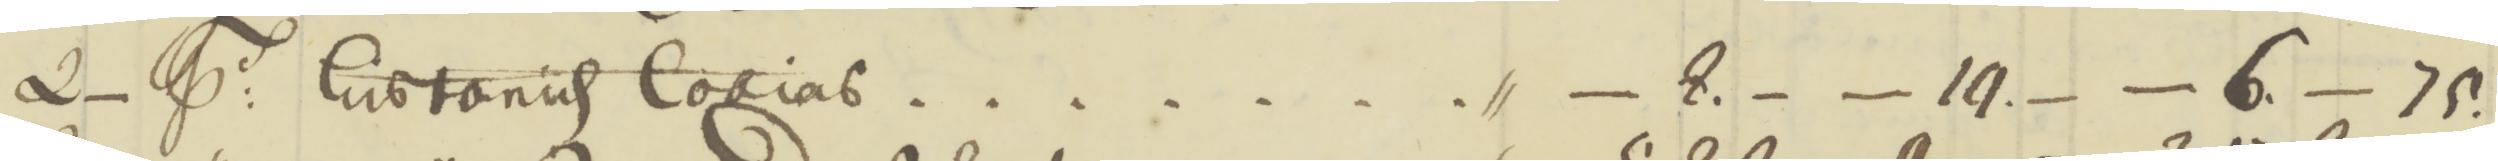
2— p:s historien tobias . . . . . . . „ 8. — — 14.— — 6. — 75.
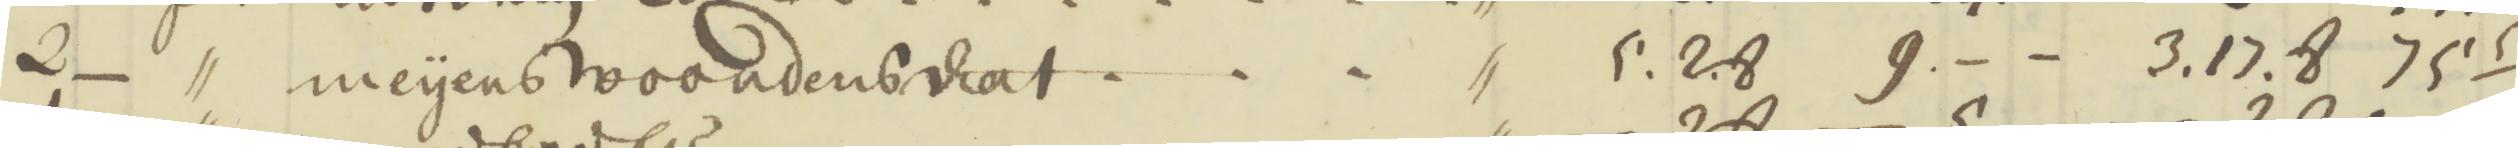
2. „ meijers woordenschat . . . „ 5 : 2.8 9.— — 3.17.8 75 5/8
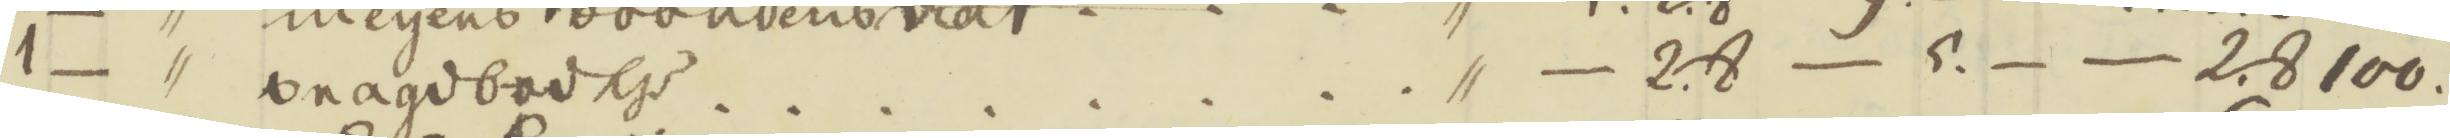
1 „ vrageboekje . . . . . . . . . . „ 2.8 — 5. — — 2.8 100.
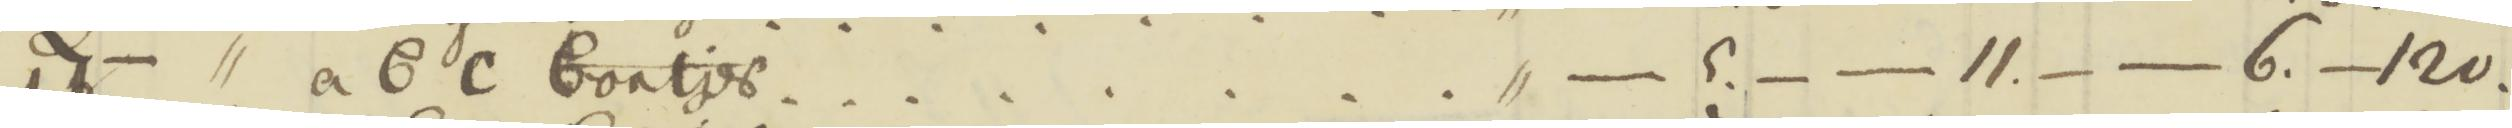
2—„ a b c bortjes . . . . . . . . . . „— 5. — — 11. — — 6.—120.
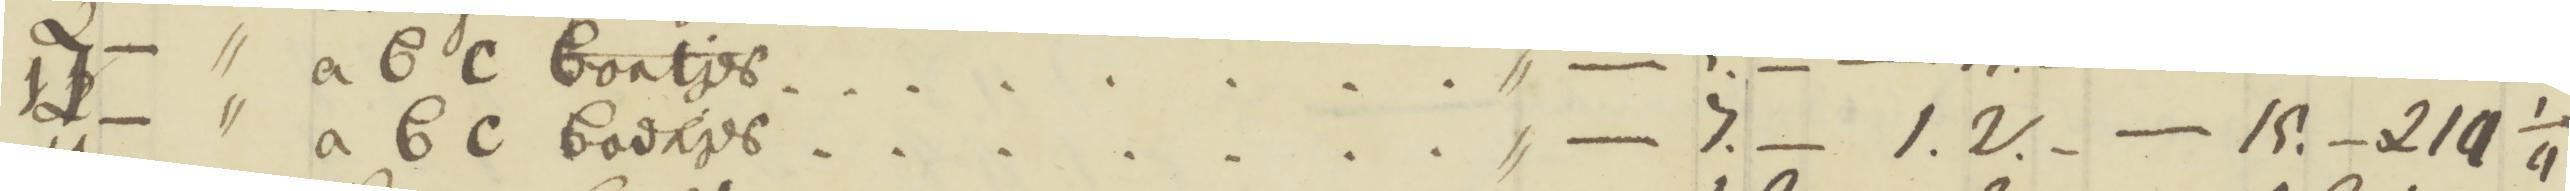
11— „ a b c boekjes . . . . . . . „ — 7. —1.2.— — 15.— 214 ¼
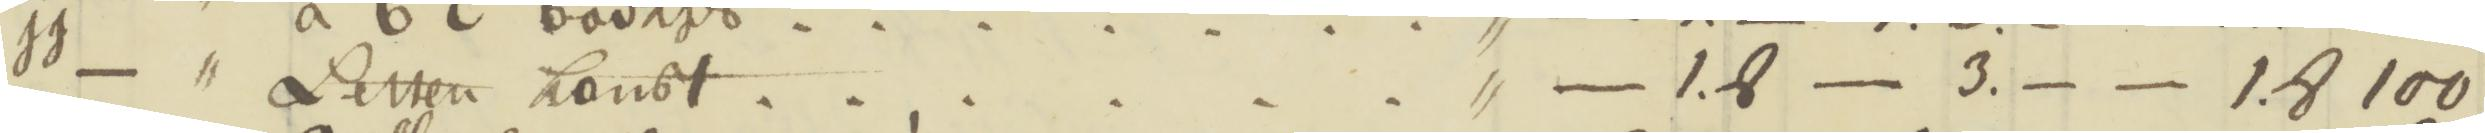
11— „ Letter konst . . . . . . . „ 1.8 — 3. — — 1.8 100
